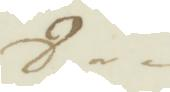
8 „ —
